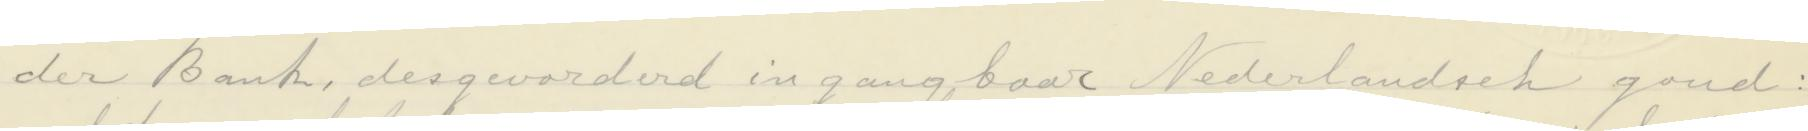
der Bank, desgevorderd in gangbaar Nederlandsch goud
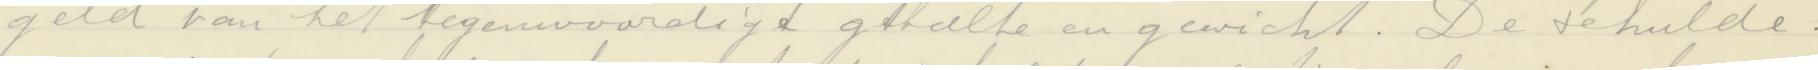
geld van het tegenwoordige gehalte en gewicht. De schulde
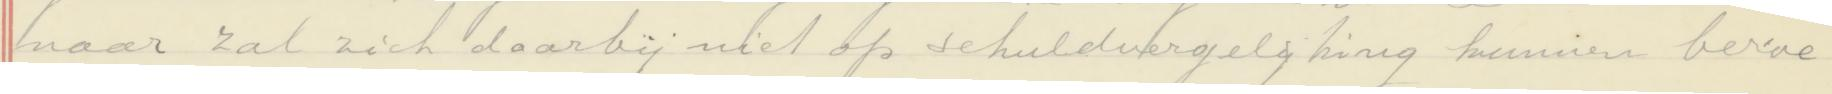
naar zal zich daarbij niet op schuldvergelijking hunnen beroe
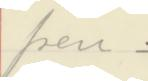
pen
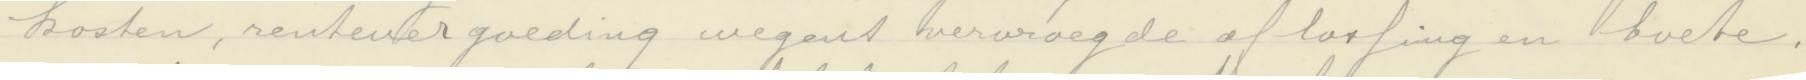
kosten, rentevergoeding wegens vervroegde aflossing en boete
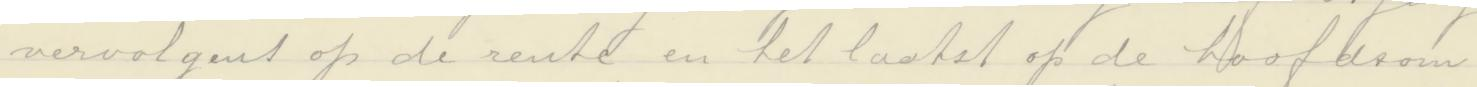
vervolgens op de rente en het laatst op de hoofdsom
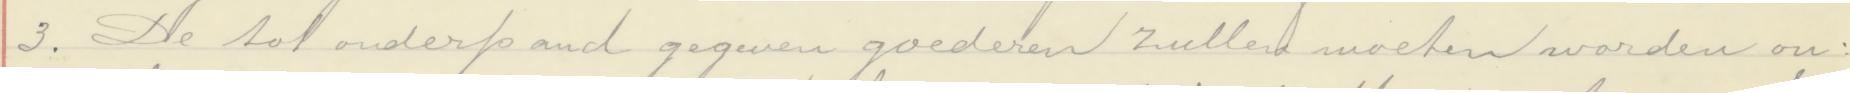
3. De tot onderpand gegeven goederen zullen moeten worden on
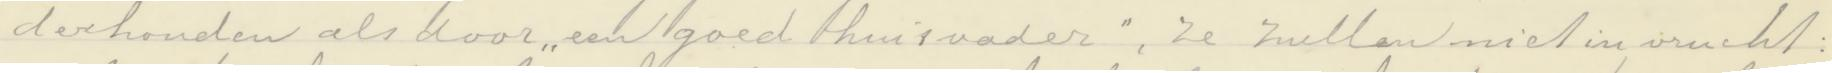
derhouden als door „ een goed huisvader ", te zullen niet in vrucht
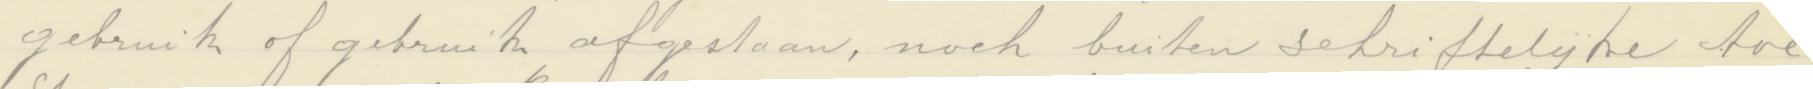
gebruik of gebruik afgestaan, noch buiten schriftelijke toe
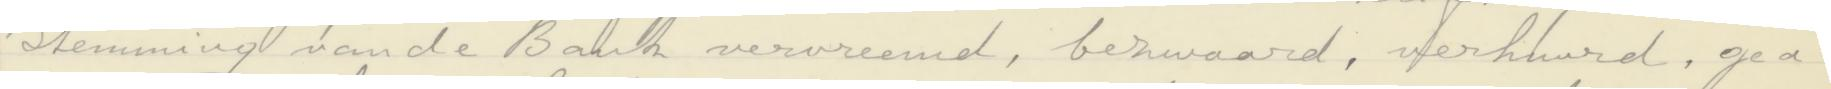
stemming van de Bank vervreemd, bezwaard, verhuurd, gea
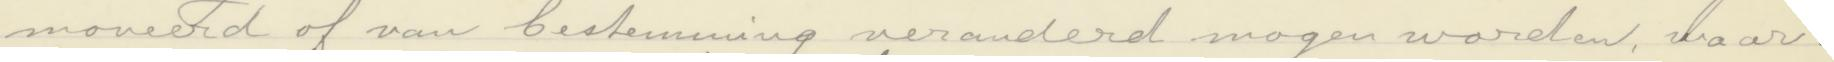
moneerd of van bestemming veranderd mogen worden, waar:
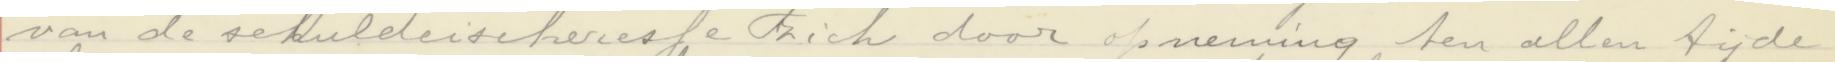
van de schuldeischeresse zich door opneming ten allen tijde
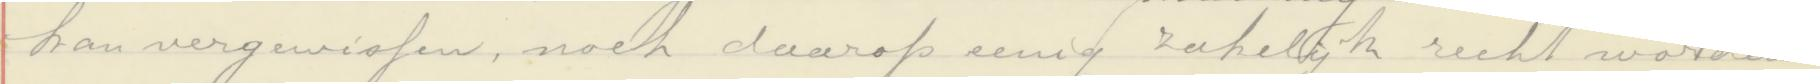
kan vergewissen, noch daarop eenig zakelijk recht worden
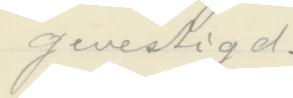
gevestigd
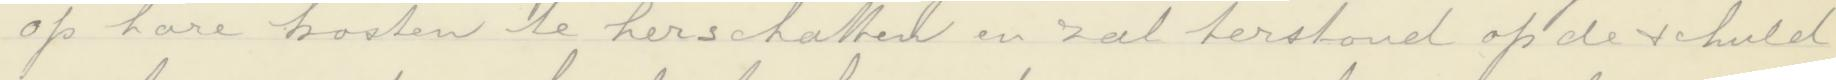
op hare kosten te herschatten en zal terstond op de schuld
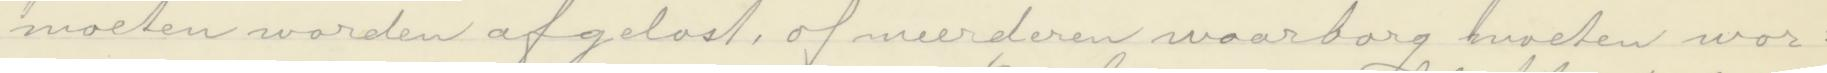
moeten worden afgelost, of meerderen waarborg moeten wor
